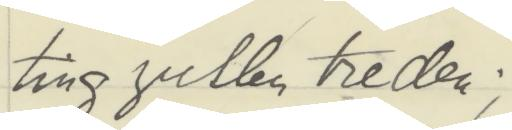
ting zullen treden
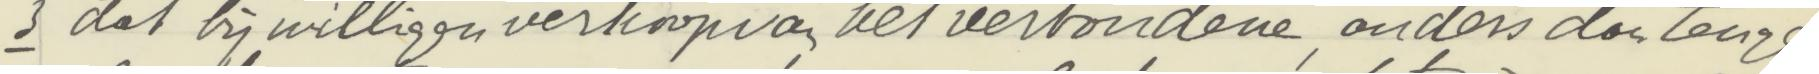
3 dat bij willigen verkoop van het verbondene, anders dan tenge
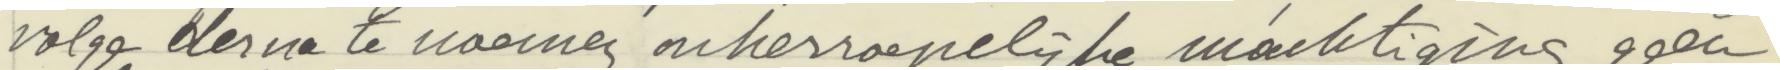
volge der na te noemen onherroepelijke machtiging, geen
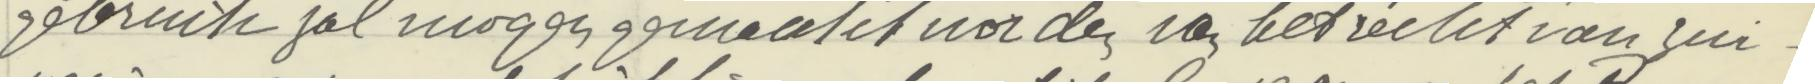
gebruik zal mogen gemaakt worden van het recht van zui-
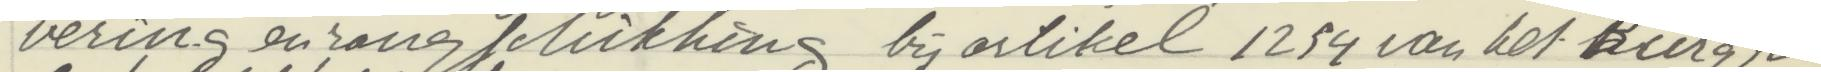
vering en rangschikking bij artikel 1254 van het Burger
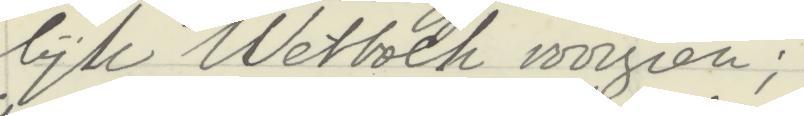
lijk Wetboek voorzien;
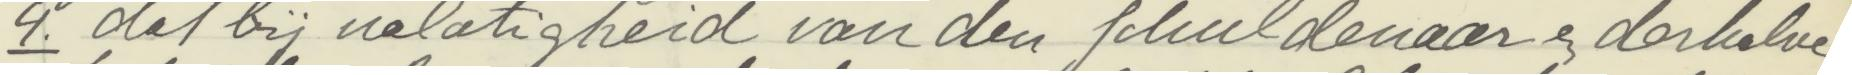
4. dat bij nalatigheid van den schuldenaar en derhalve
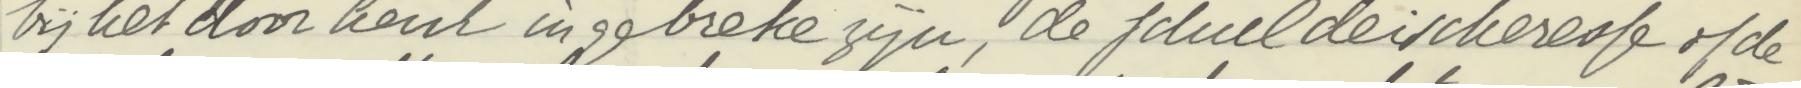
bij het door hem ingebreke zijn, de schuldeischeresse of de
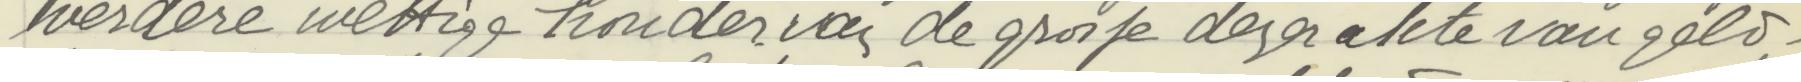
verdere wettige houder van de grosse dezer akte van geld
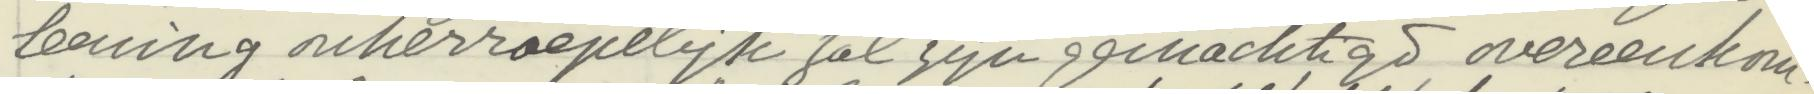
leening onherroepelijk zal zijn gemachtigd overeenkom
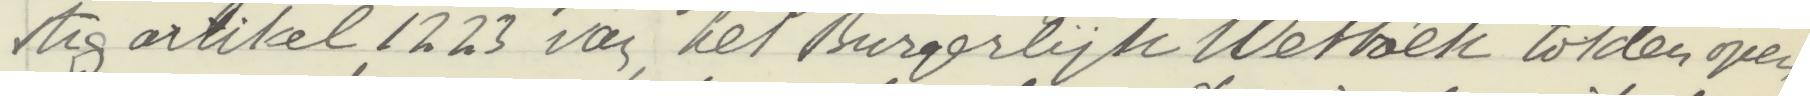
stig artikel 1223 van het burgerlijk Wetboek tot den open
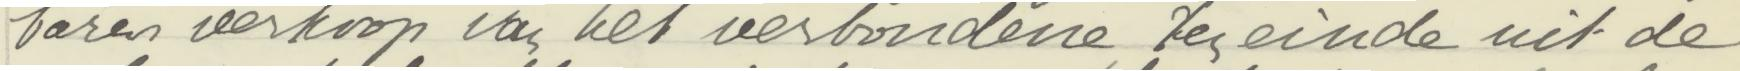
baren verkoop van het verbondene, ten einde uit de
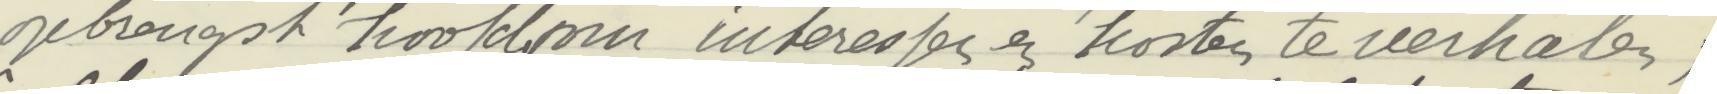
opbrengst hoofdsom, interessen en kosten te verhalen;
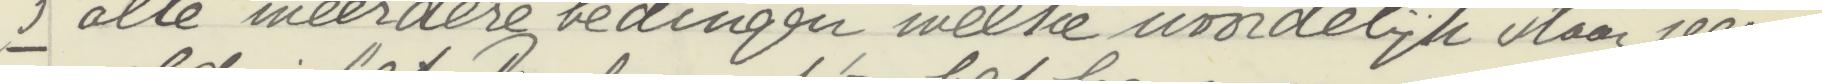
5 alle meerdere bedingen, welke woordelijk staan ver-
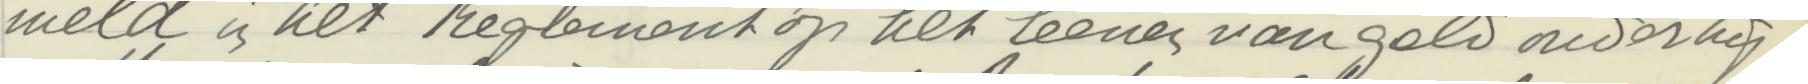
meld in het Reglement op het leenen van geld onderhij-
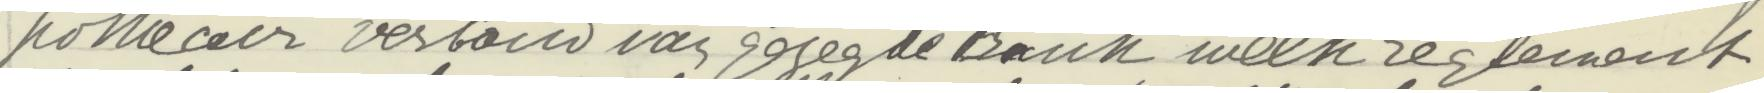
pothecair vebond van gezegde bank welk reglement
